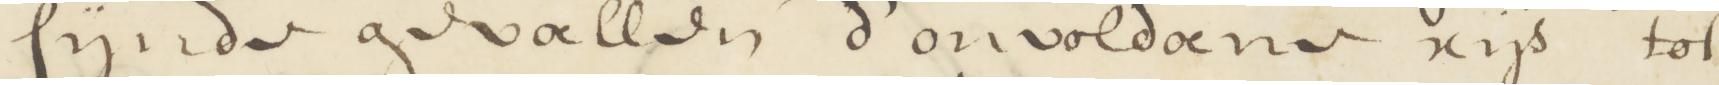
sijnde gevallen d'onvoldoene rijs tot
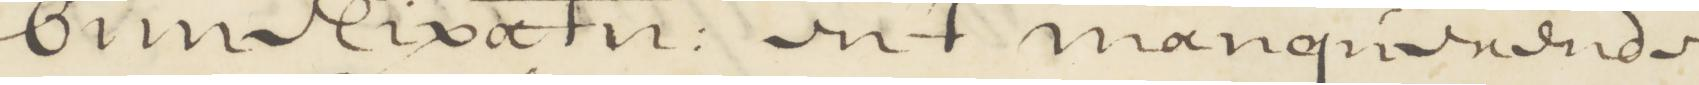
bimelipatu: en't manquerende
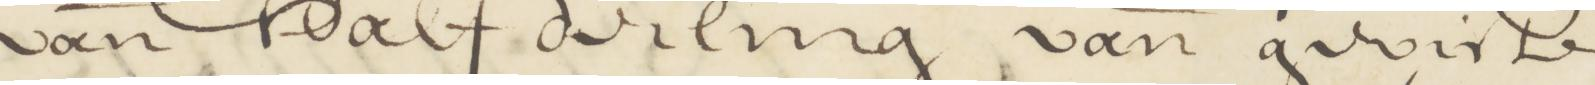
van half deiling van geviste
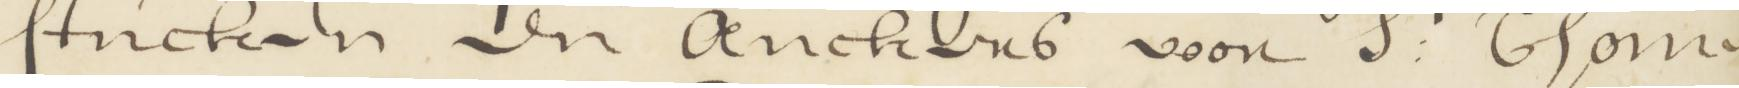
stucken en anckers voor S:t Thom
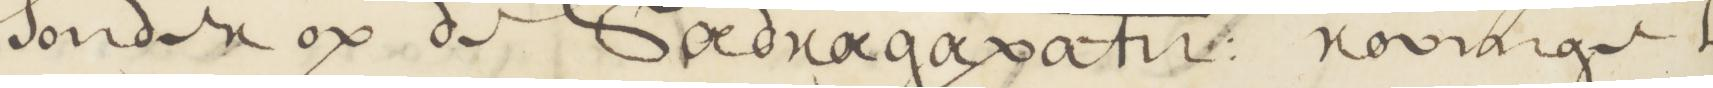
souden op de Sadragapatu: rovinge t
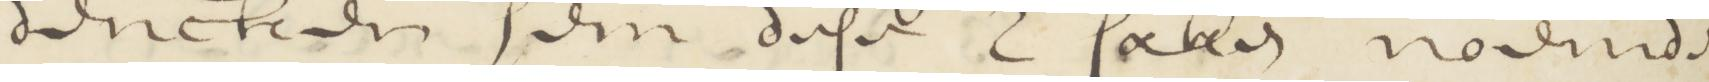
dencken hem dese 2 saken noemde
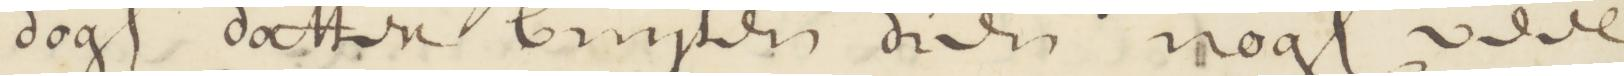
dogh datter buijten dien nogh veel
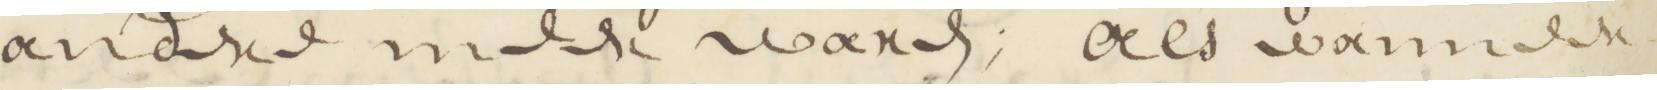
andere meer waren; als wanneer
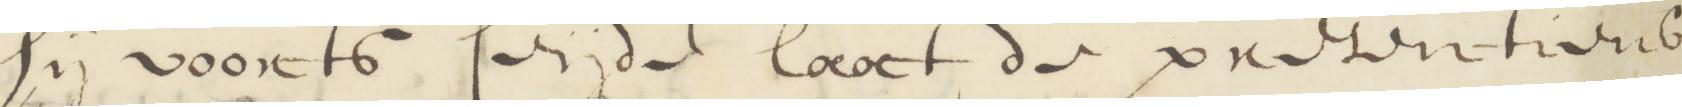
hij voorts seijde laat de pretentiens
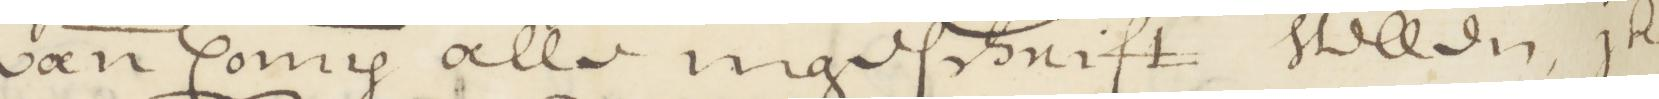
van Comp alle ingeschrift stellen, jk
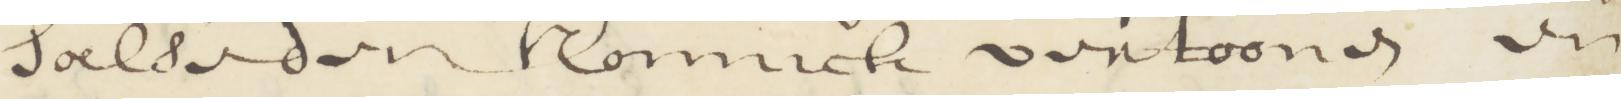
salse den Koninck vertoonen en
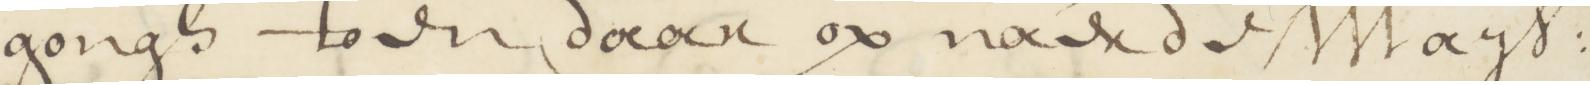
gongh toen daar op naer de Mays:t
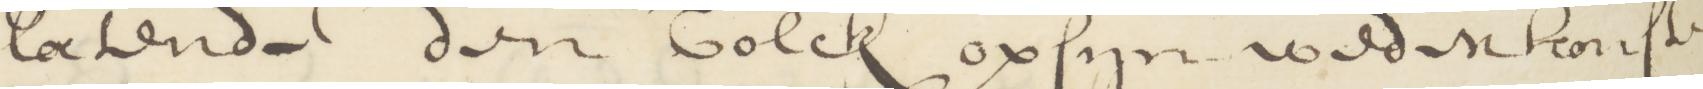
latende den Tolck op syn wederkonste
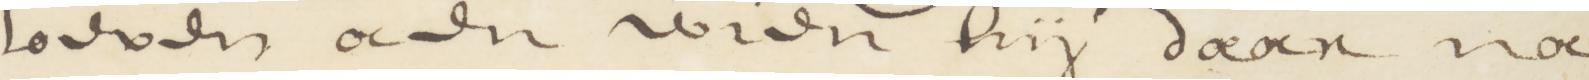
toeven aen wien hij daer na
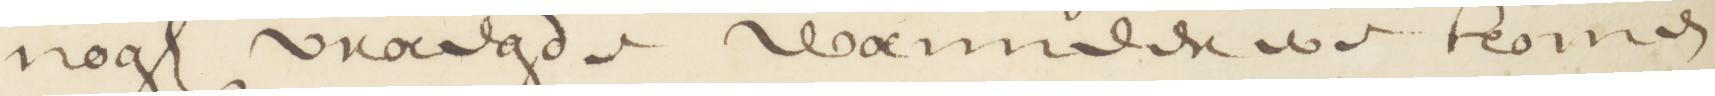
nogh vraegde wanneer we komen
